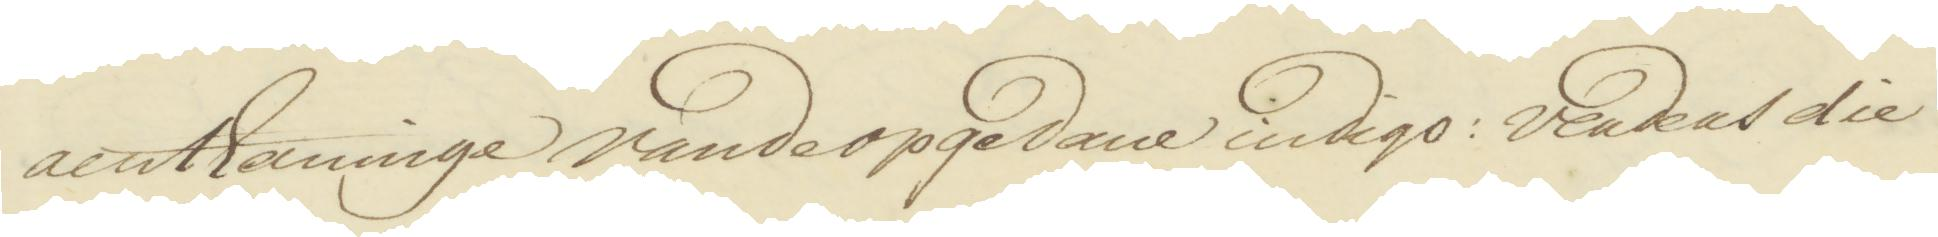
aenthoninge vande opgedane indigo: verders die
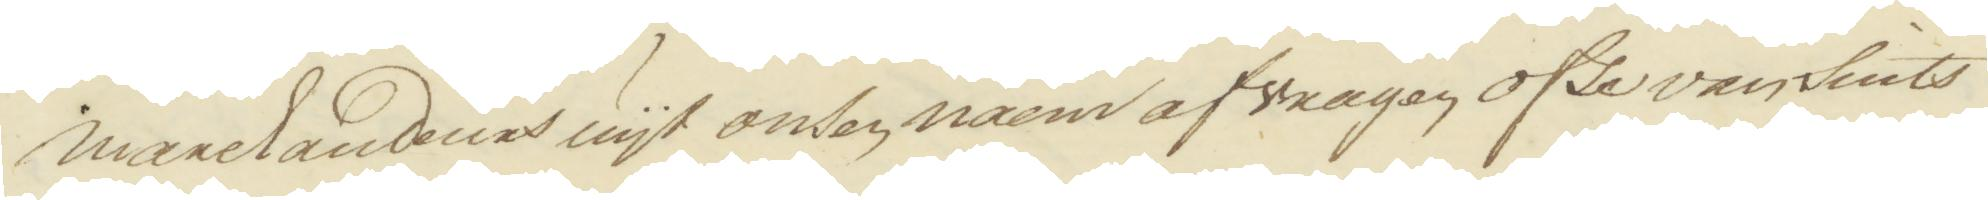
marchandeurs uijt onsen naem afvragen ofze vansints
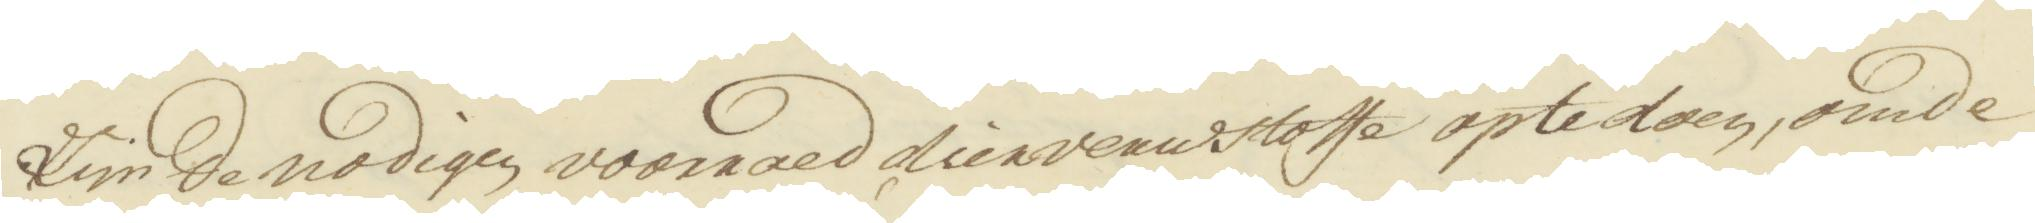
zijn de nodigen voorraed dier verwstoffe op te doen, om de
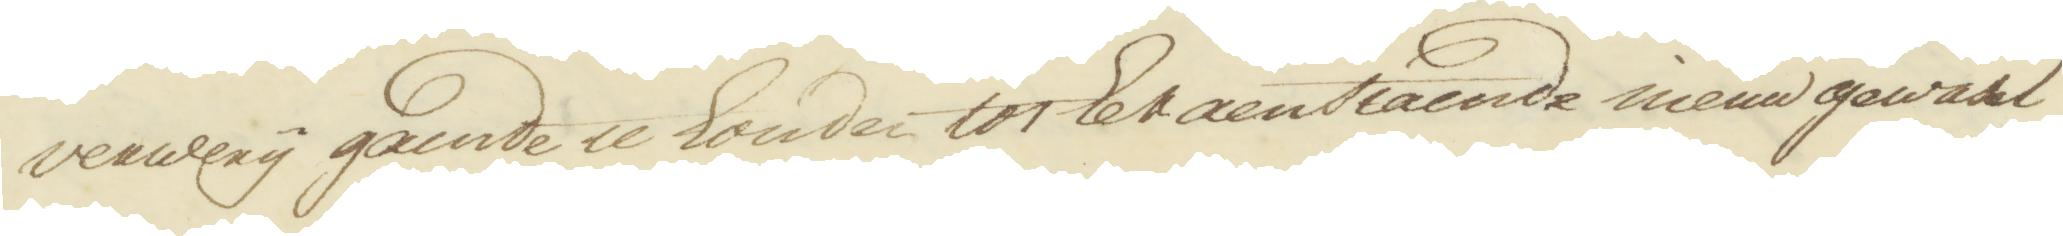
verwerij gaende te houden tot het aenstaende nieuw gewasch
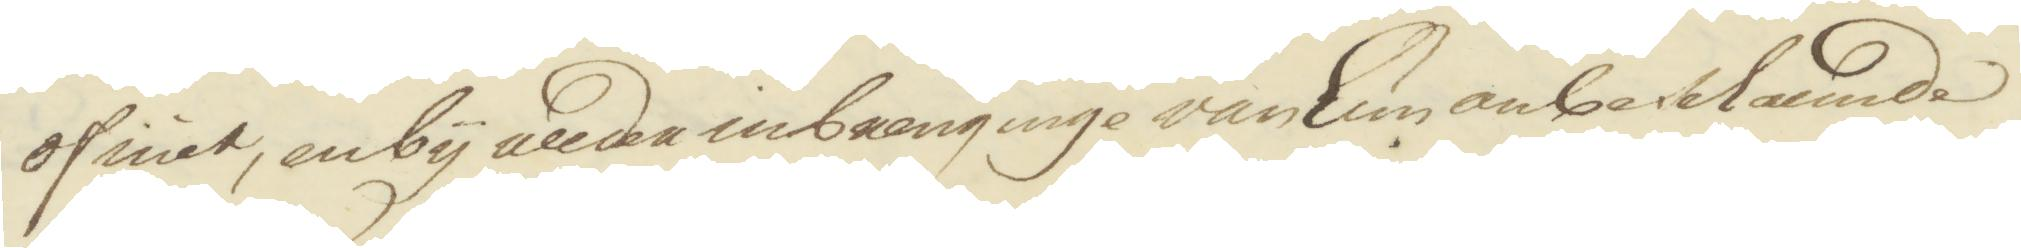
of niet, en bij weder inbrenginge van hun onbeschaemde
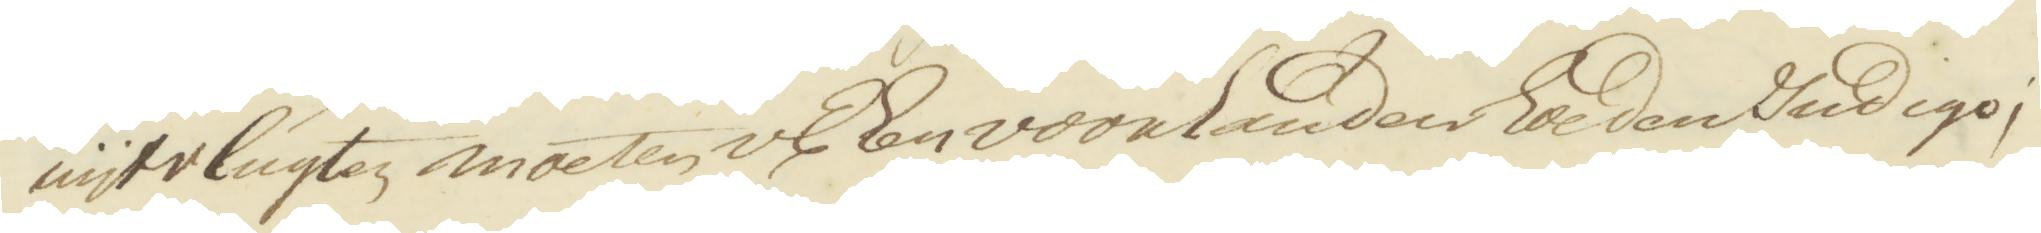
uijtvlugten moeten uE hen voorhouden hoe den Indigo;
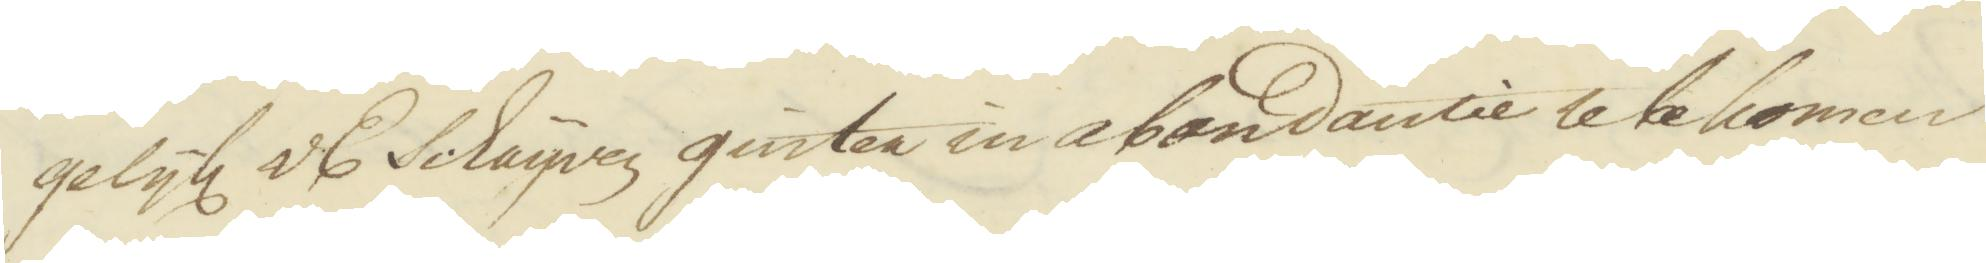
gelijk uE schrijven ginter in abondantie te bekomen
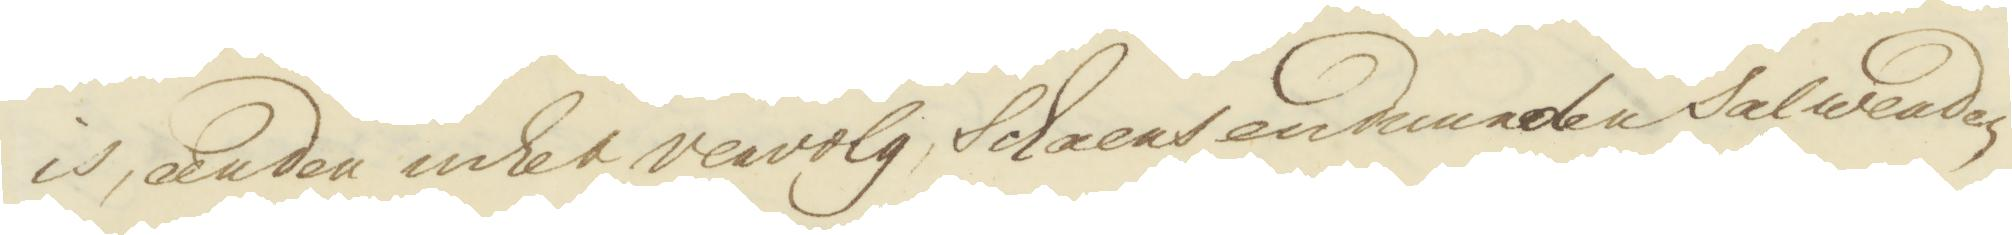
is, eerder inhet vervolg, schaers en duurder sal werden
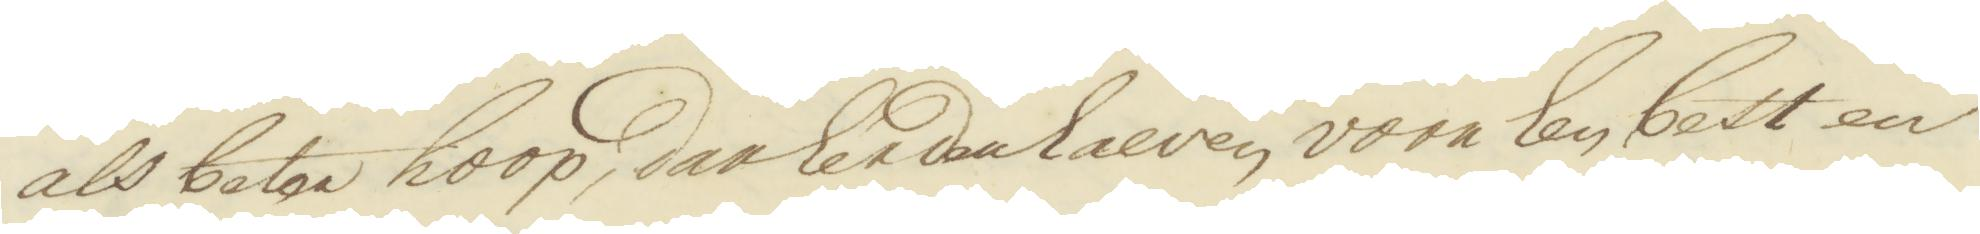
als beter hoop, dat het derhalven voor hen best en
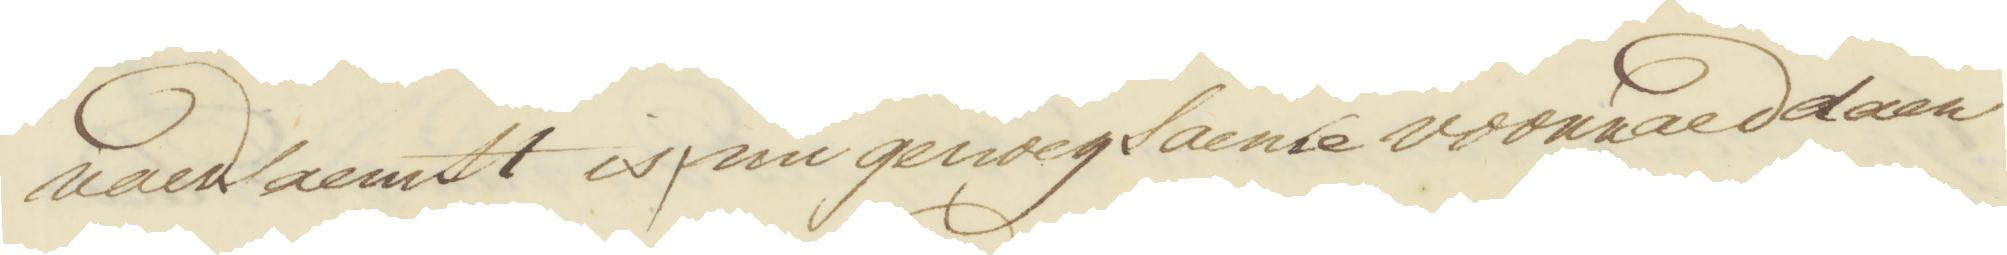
raedsaemst is, nu genoegsaeme voorraed daar
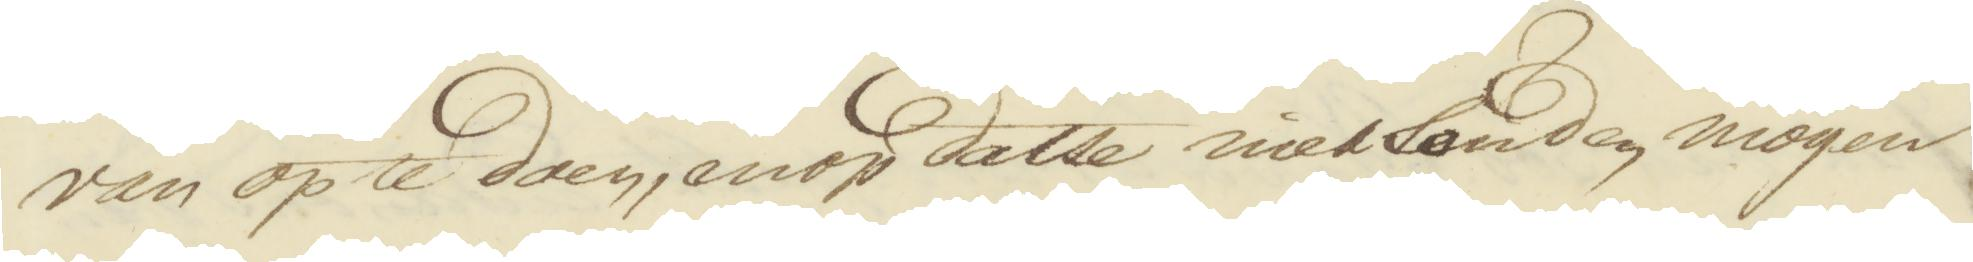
van op te doen, en op datse niet souden mogen
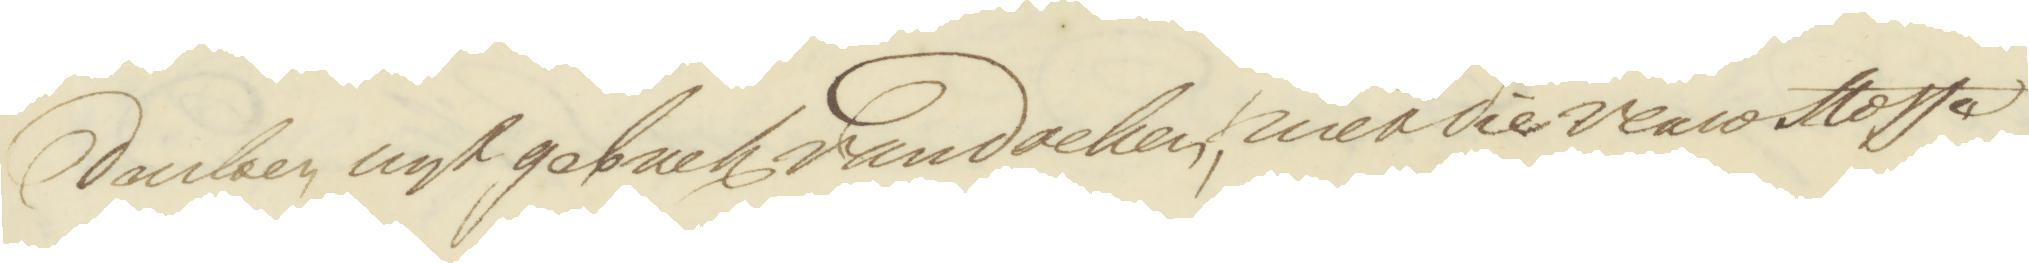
duiken uijt gebrek van doeken, met die verwstoffe
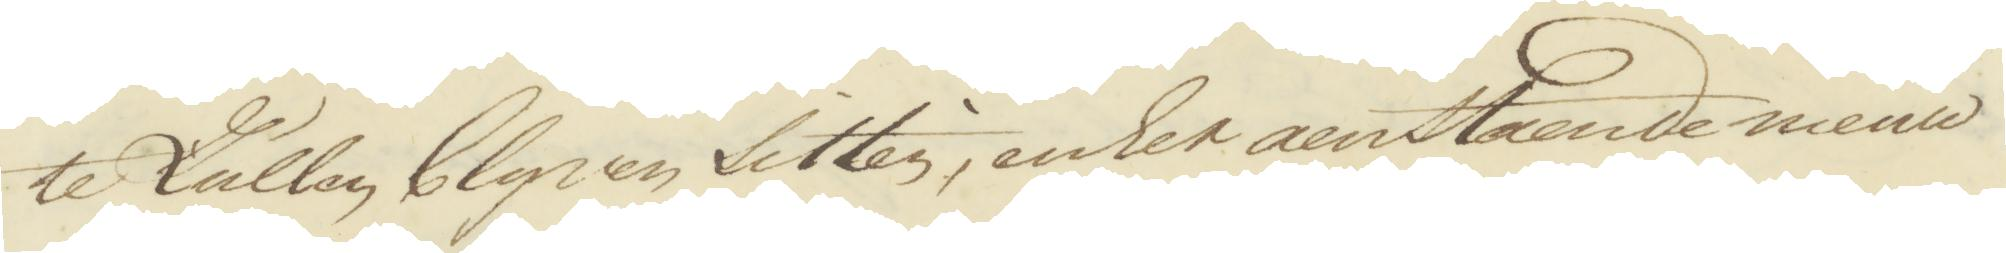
te zullen blyven sitten, en het aenstaende nieuw
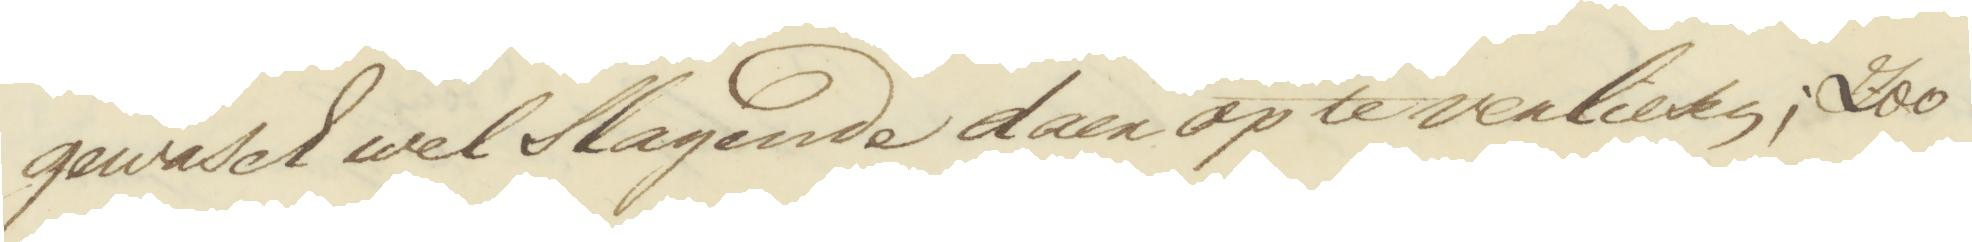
gewasch wel slagende daer op te verliesen; zoo
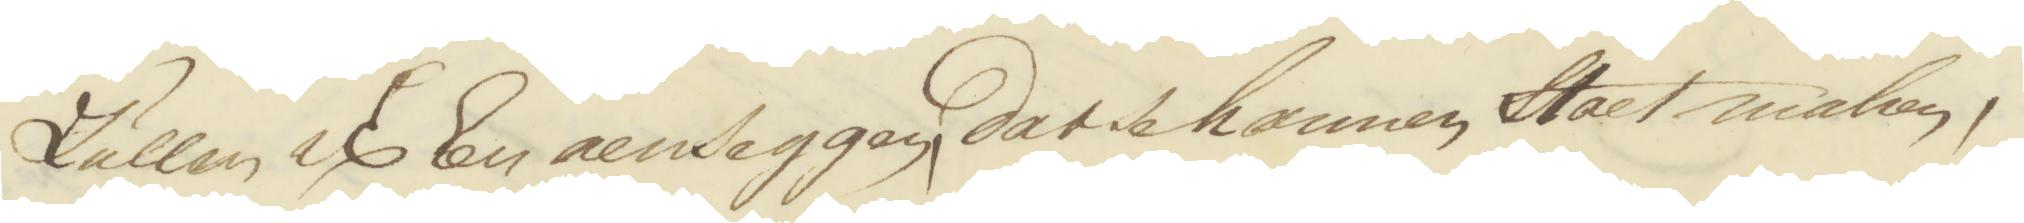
zullen uE hen aenseggen, dat te konnen staet maken,
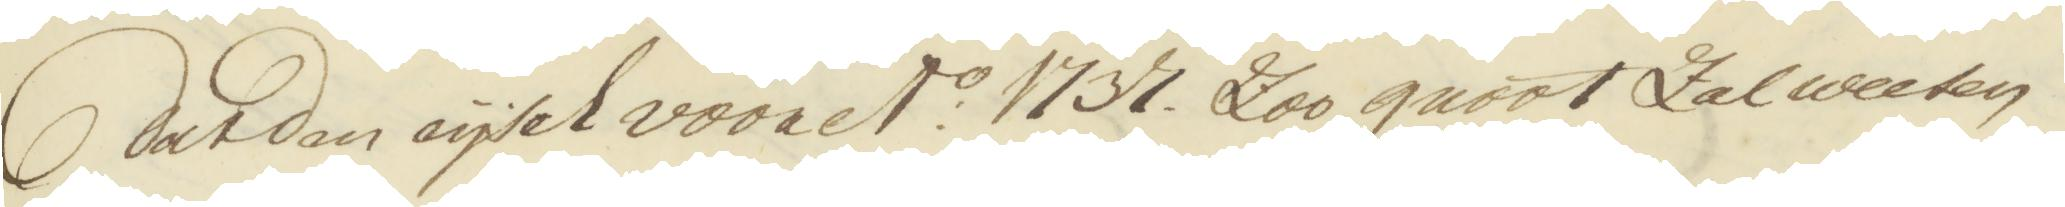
dat den eijsch voor A:o 1737. zoo groot zal weesen
